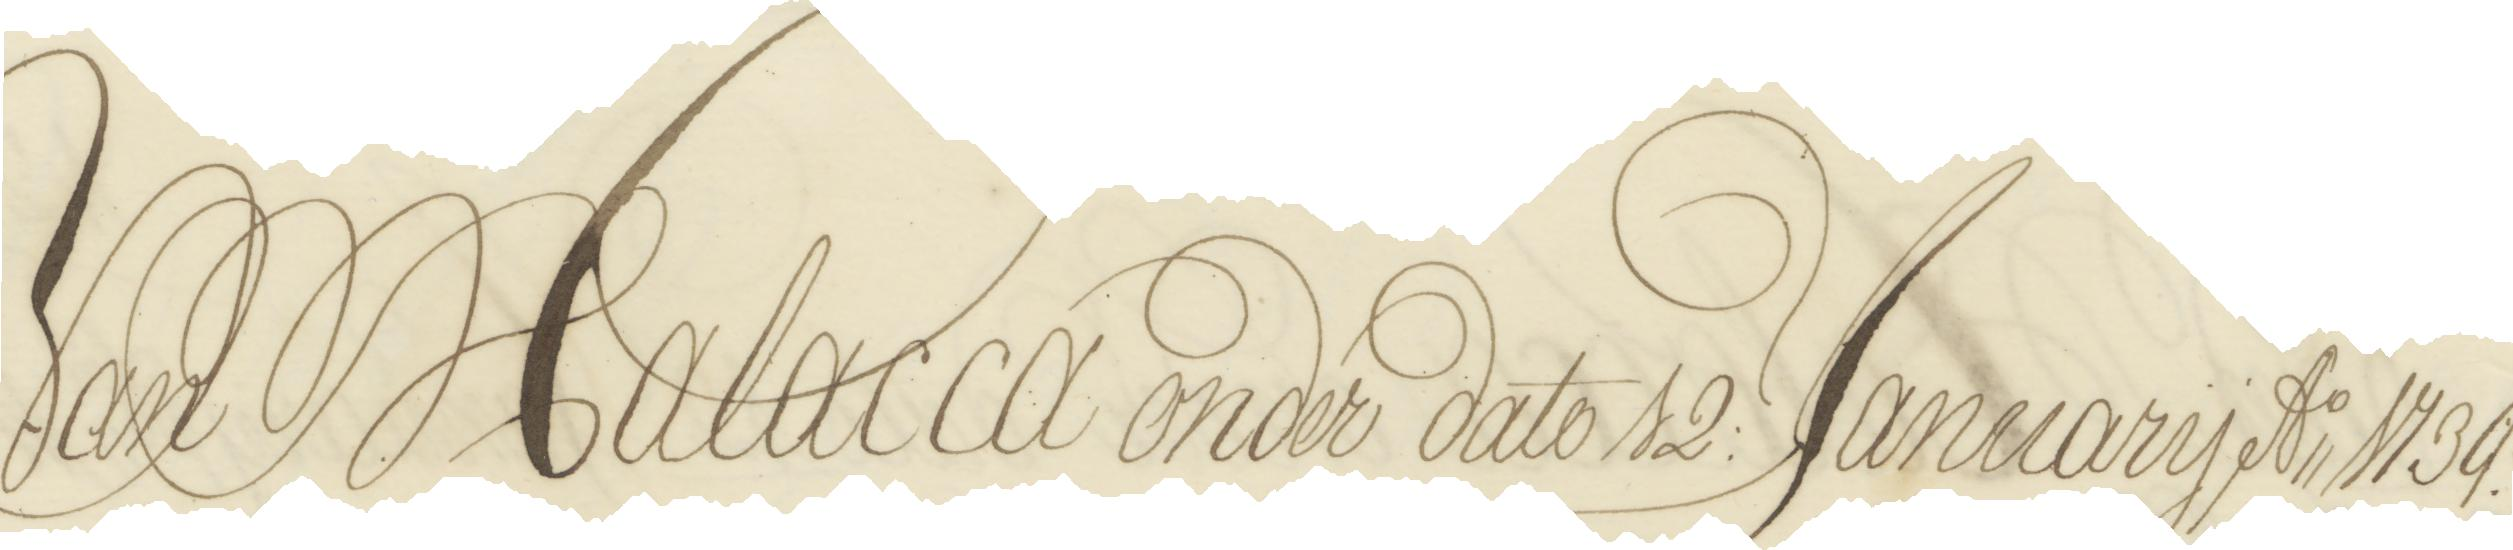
Van Malacca onder dato 12:' Januarij A„o 1734:
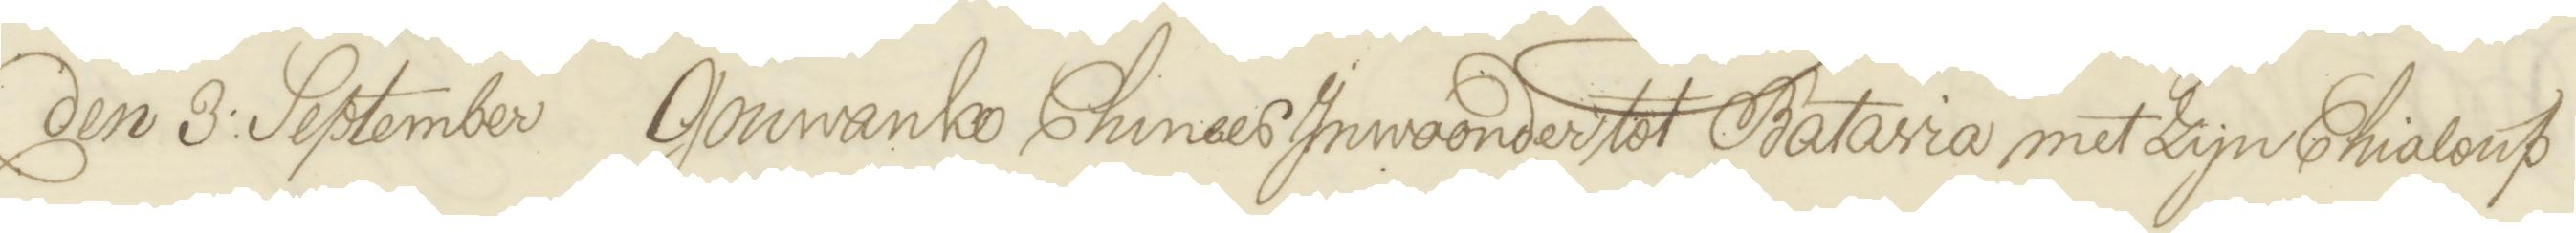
den 3: September Gouwanko Chinees Jnwoonder tot Batavia met zijn Chialoup
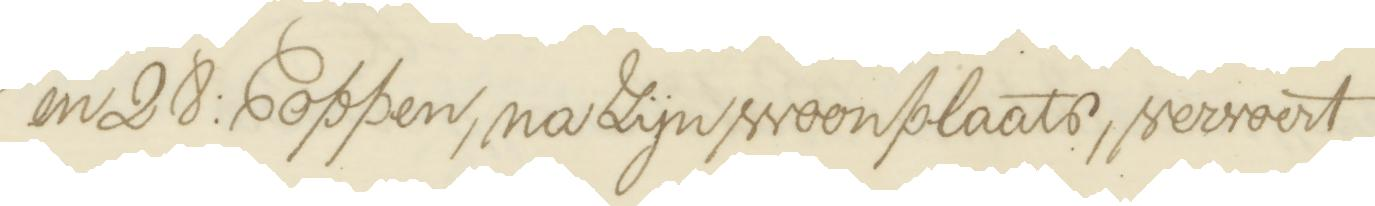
en 28: Coppen, na zijn woonplaats, vervoert
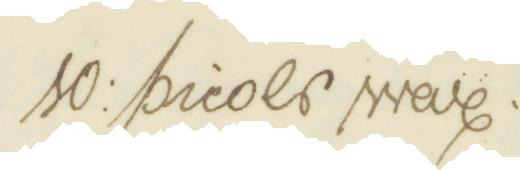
10: picols wax
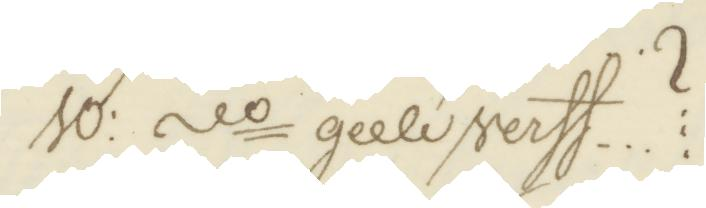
10: d=o geele verff...
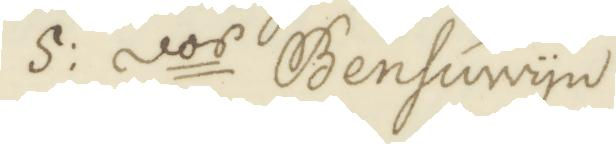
5: d=os Bensuwijn
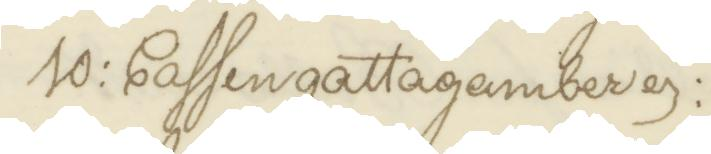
10: bassen gattagamber en
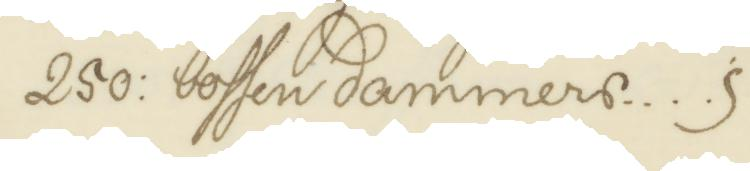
250: bossen dammers....
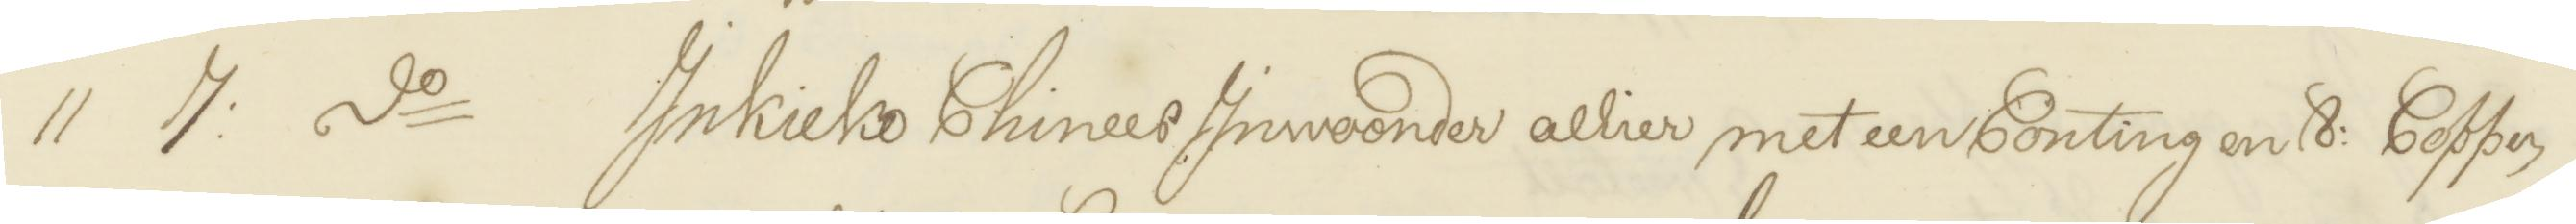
„ 7: d=o Jnkieko Chinees Jnwoonder alhier met een Conting en 8: Coppen
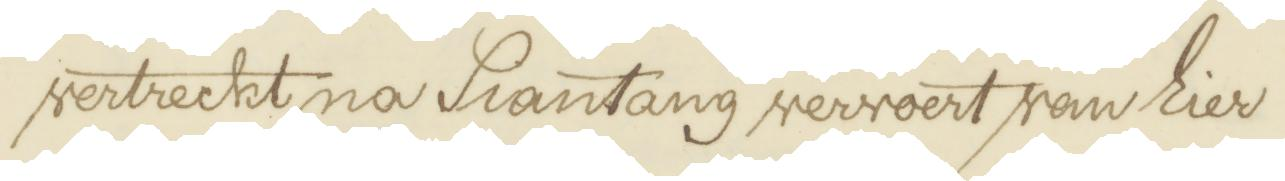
vertreckt na Siantang vervoert van hier
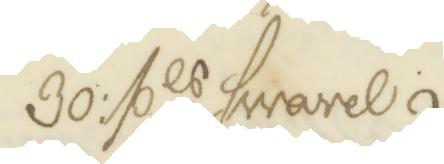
30: p=ls swavel
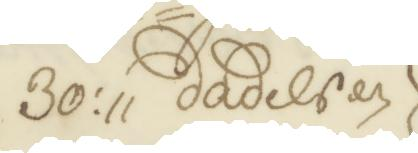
30:„ dadels en
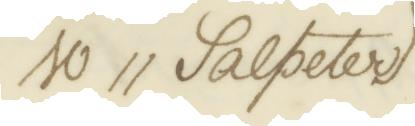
10 „ salpeter
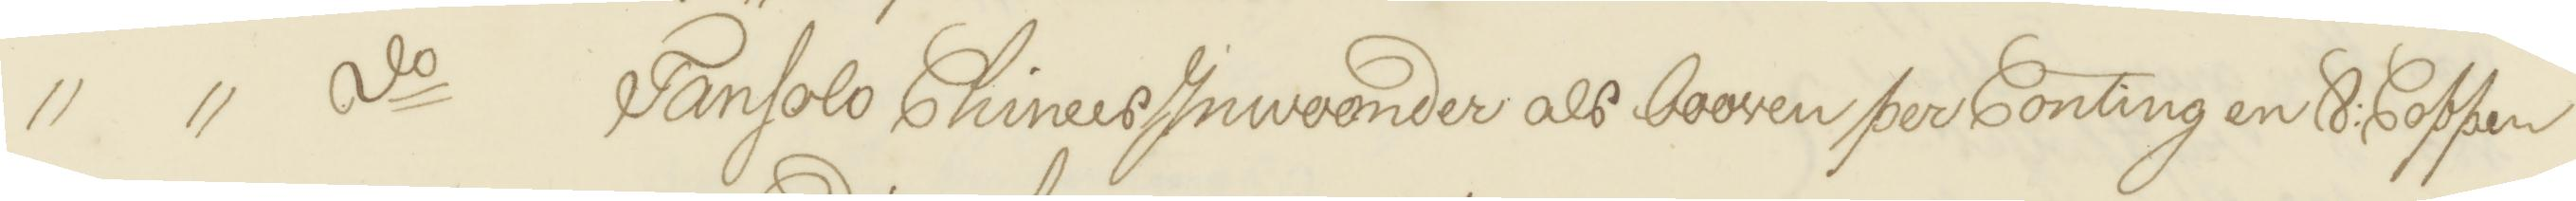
„ „ d=o Tansolo Chinees Jnwoonder als booven per Conting en 8: Coppen
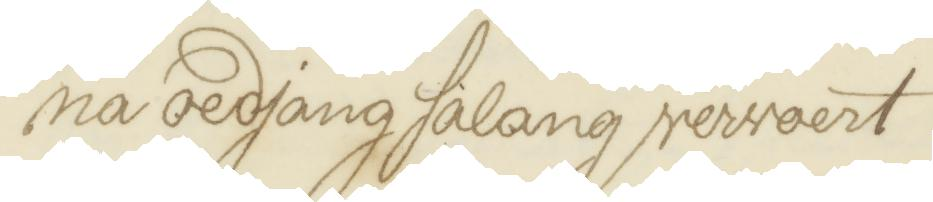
na oedjang salang vervoert
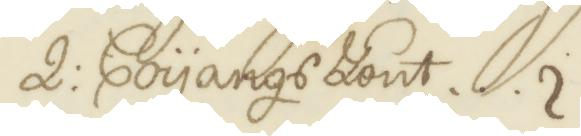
2: Coijangs zout ...
